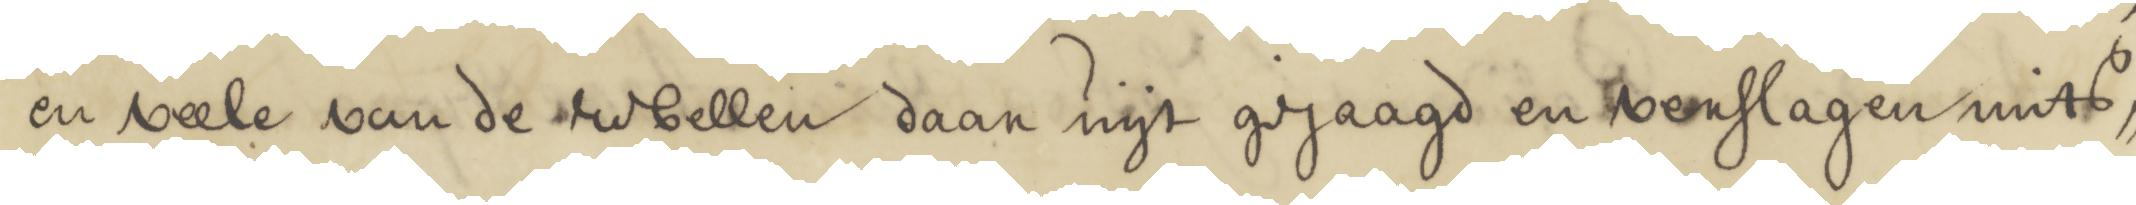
en veele van de rebellen daar uijt gejaagd en verslagen mits„
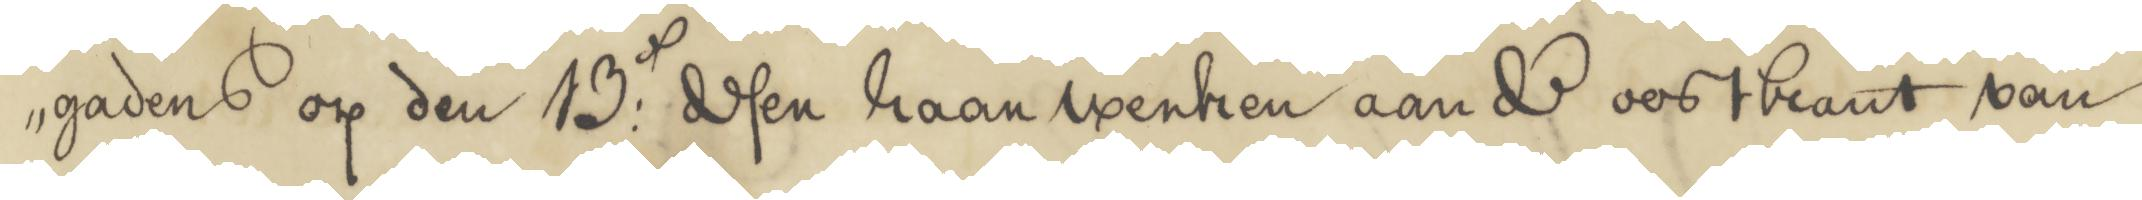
„gaders op den 13:e deser haar werken aan de oostkant van
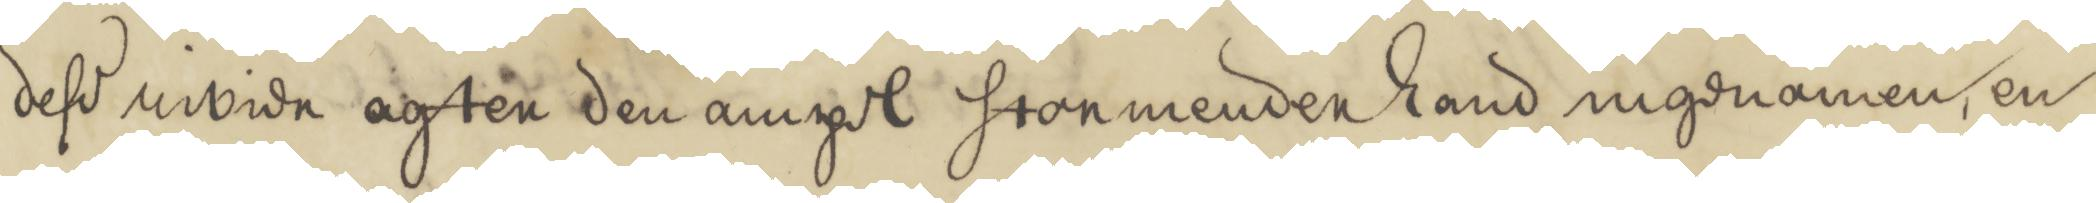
dese rivier agter den ampel stormenderhand ingenomen, en
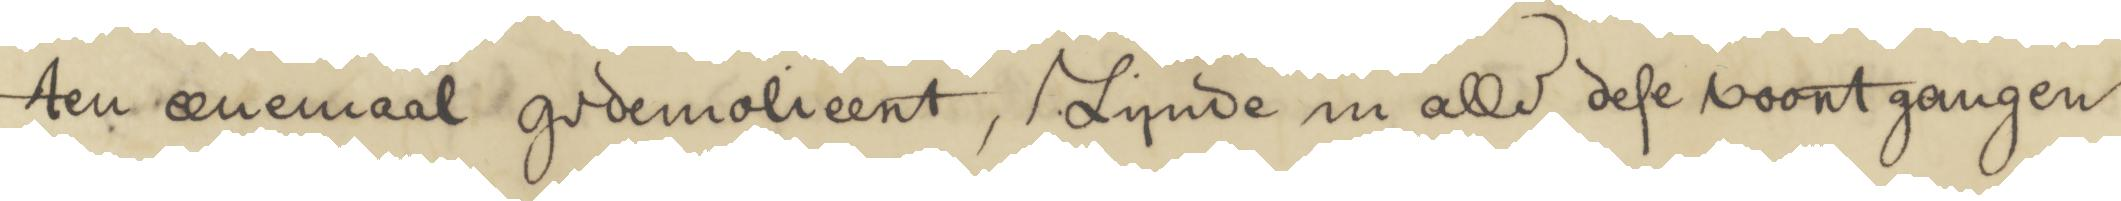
ten eenemaal gedemolieert, Zijnde in alle dese voortgangen
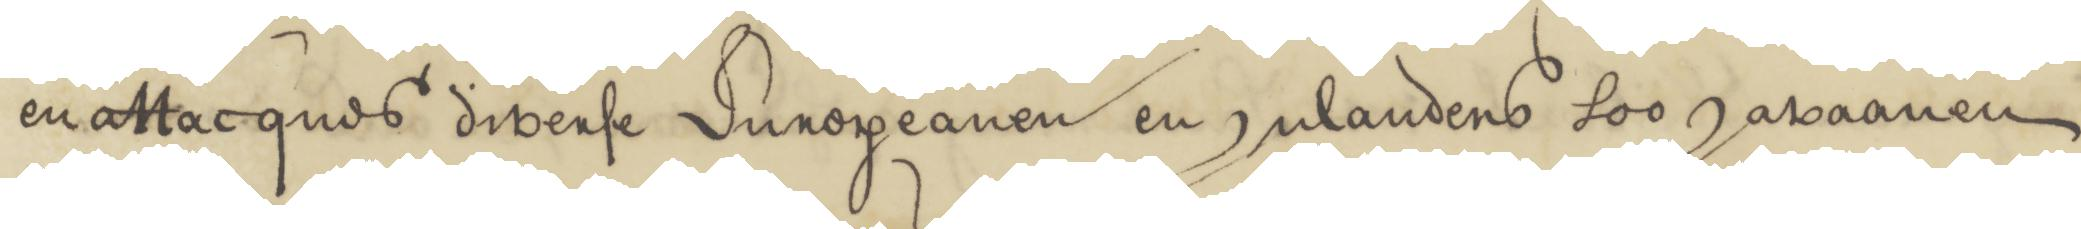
en attacques diverse Europeanen en Jnlanders soo Javaanen
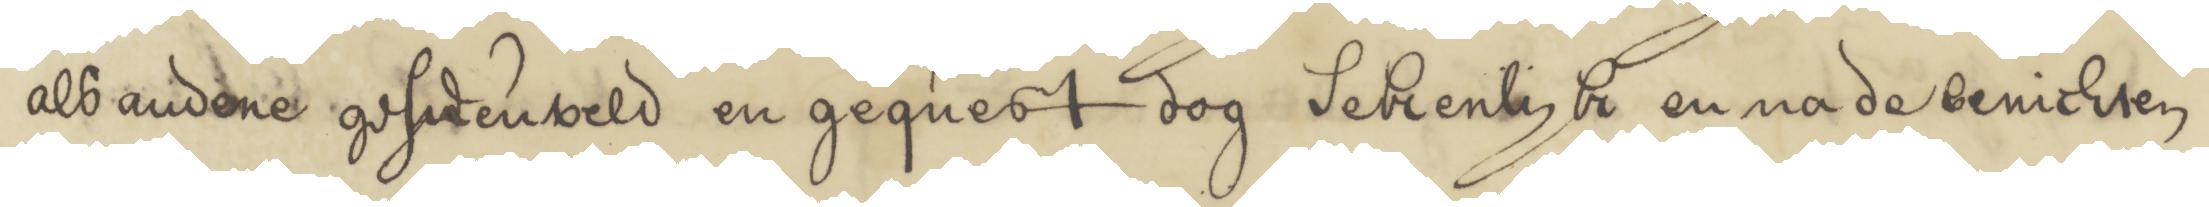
als andere gesneuveld en gequest dog Sekerlijk en na de berichten
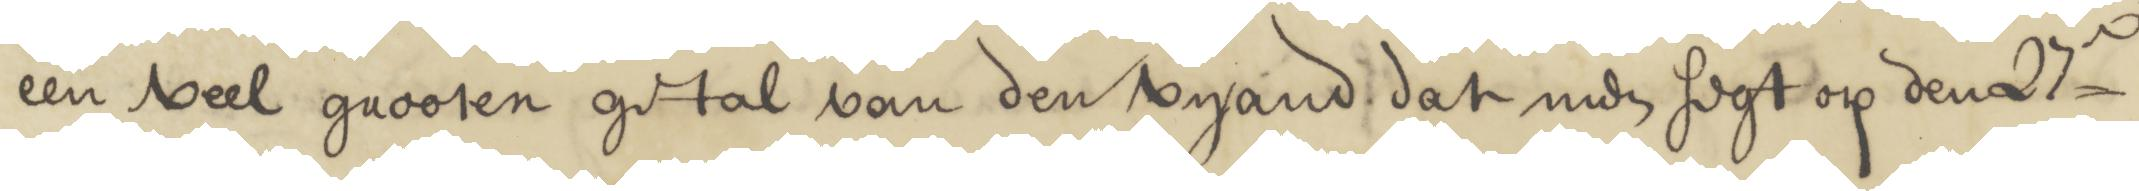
een veel grooter getal van den vijand dat men segt op den 27=e
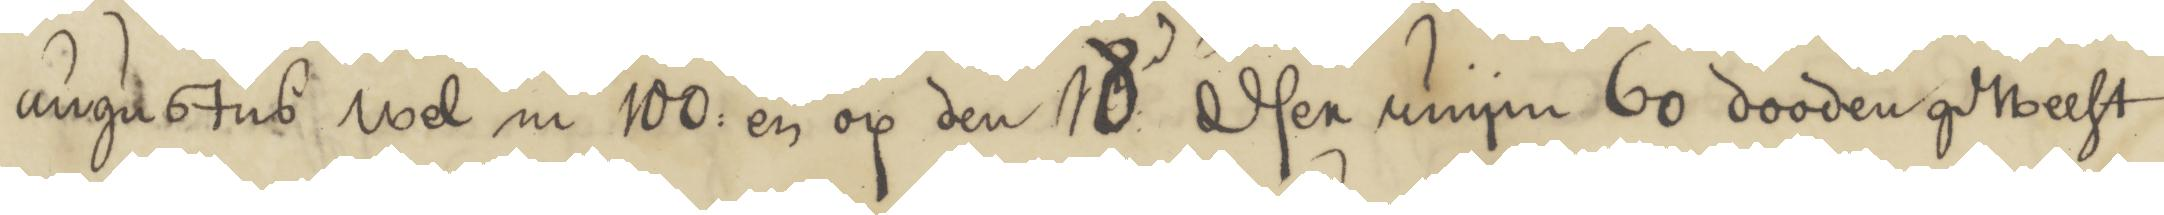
augustus wel in 100: en op den 18:e deser ruijm 60 dooden geweest
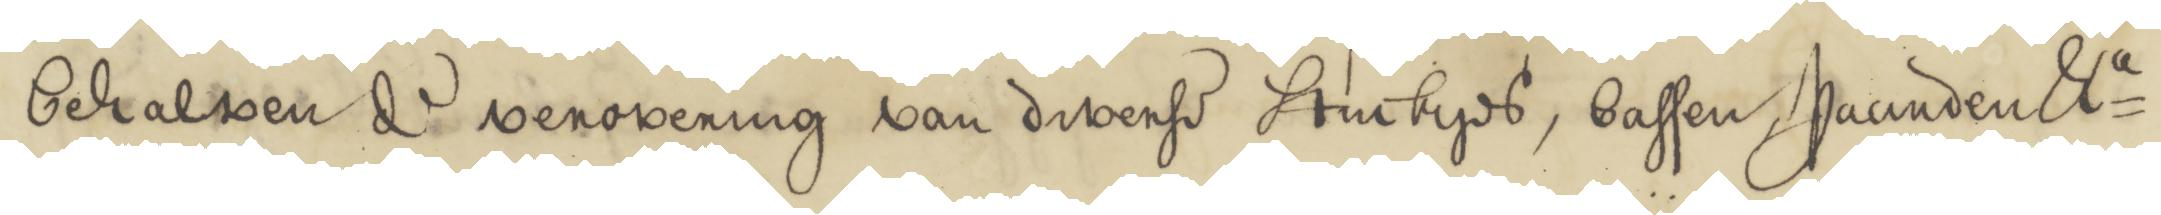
behalven de verovering van diverse stuckjes, bassen, paarden &=a
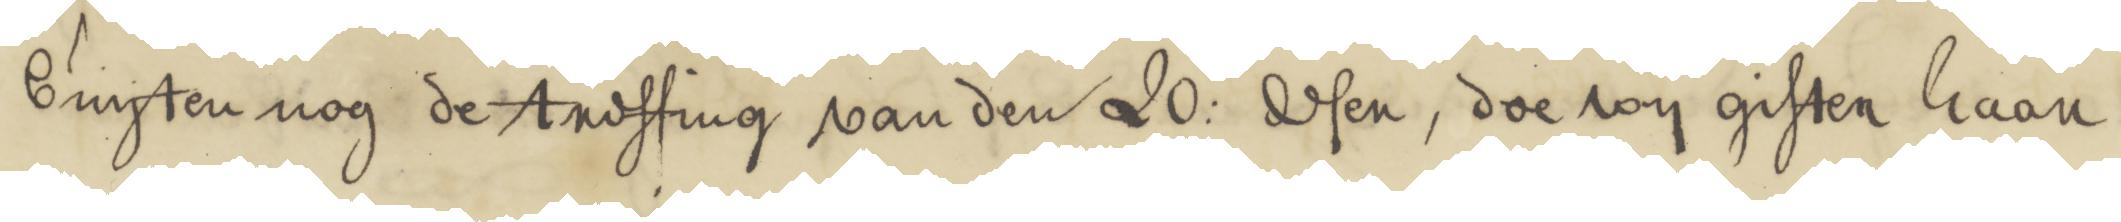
buijten nog de treffing van den 20:e deser, doe wij gister haar
